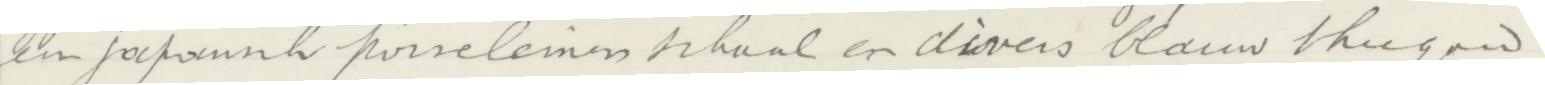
en japansch porseleinen schaal en divers blauw theegoed
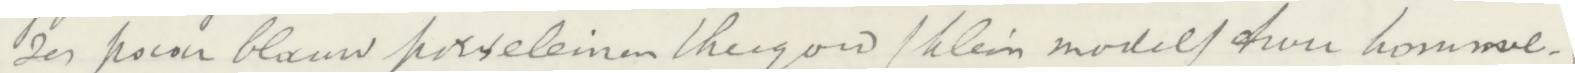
zes paar blauw porseleinen theegoed ( klein model ) twee tromme-
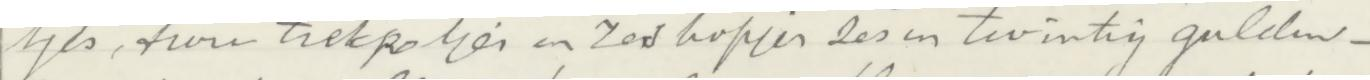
tjes, twee trekpotjes en zes kopjes zes en twintig gulden
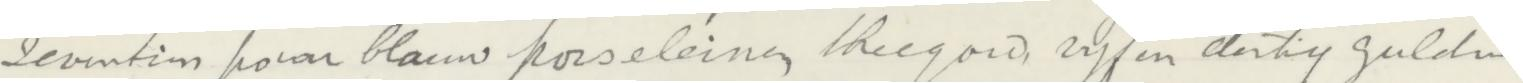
zeventien paar blauw porseleinen theegoed, vyf en dertig gulden
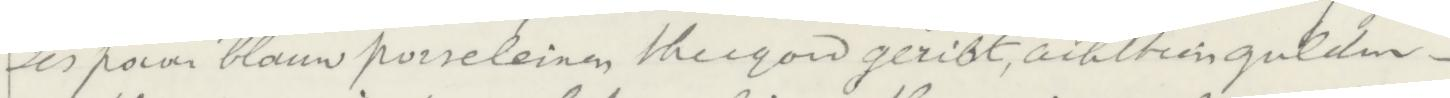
zes paar blauw porseleinen theegoed geribt, achttien gulden
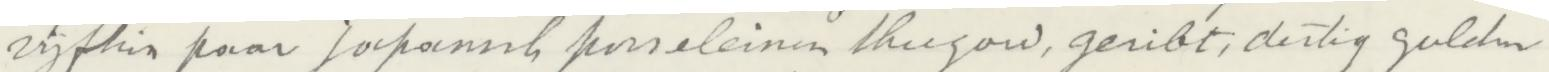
vijftien paar japansch porseleinen theegoed, geribt, dertig gulden
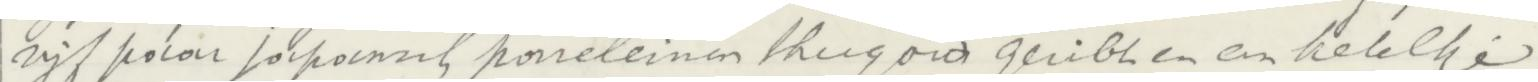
vijf paar japansch porseleinen theegoed geribt en een keteltje
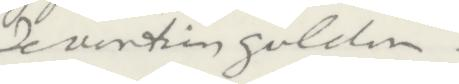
zeventien gulden
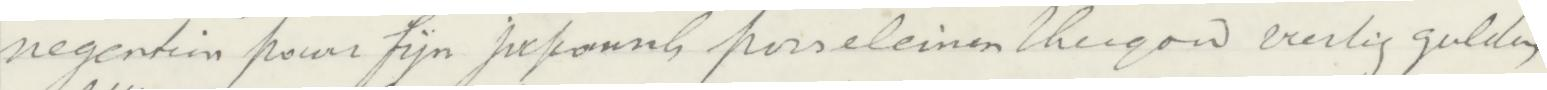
negentien paar fijn japansch porseleinen theegoed veertig gulden
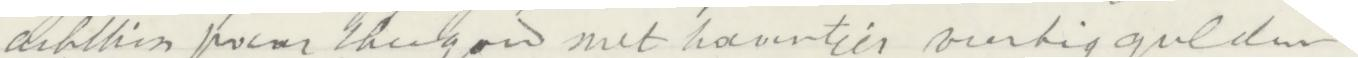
achttien paar theegoed met havertjes veertig gulden.
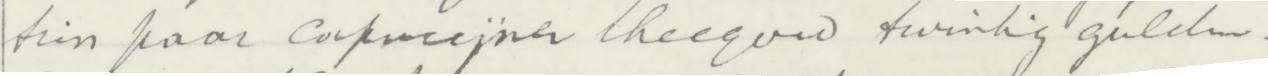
tien paar Capucijner theegoed twintig gulden.
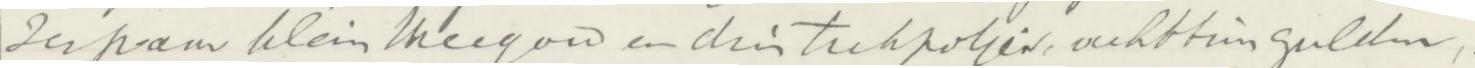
zes paar klein theegoed en drie trekpotjes, achttien gulden,
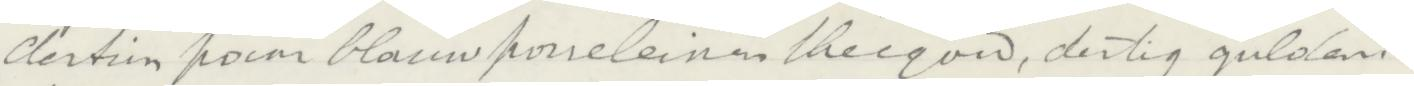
dertien paar blauw porceleinen theegoed, dertig guldens
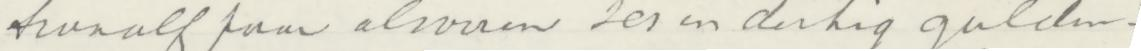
twaalf paar alsvoren zes en dertig gulden
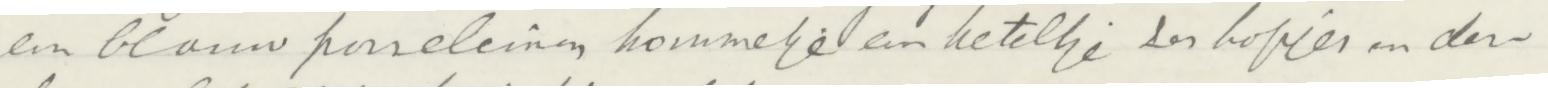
een blauw porceleinen kommetje en keteltje zes kopjes en der
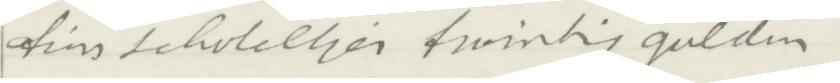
tien schoteltjes twintig gulden
